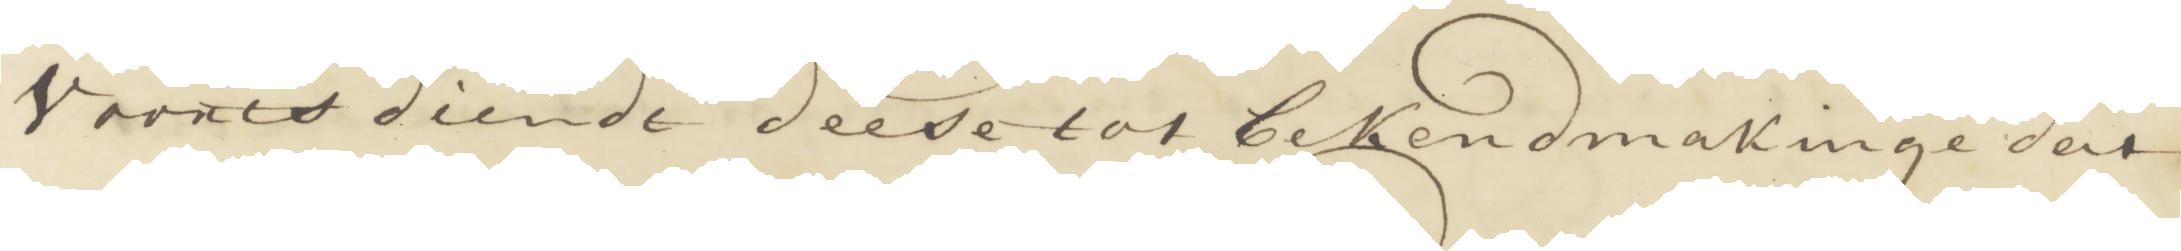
Voorts diende deese tot bekendmakinge dat
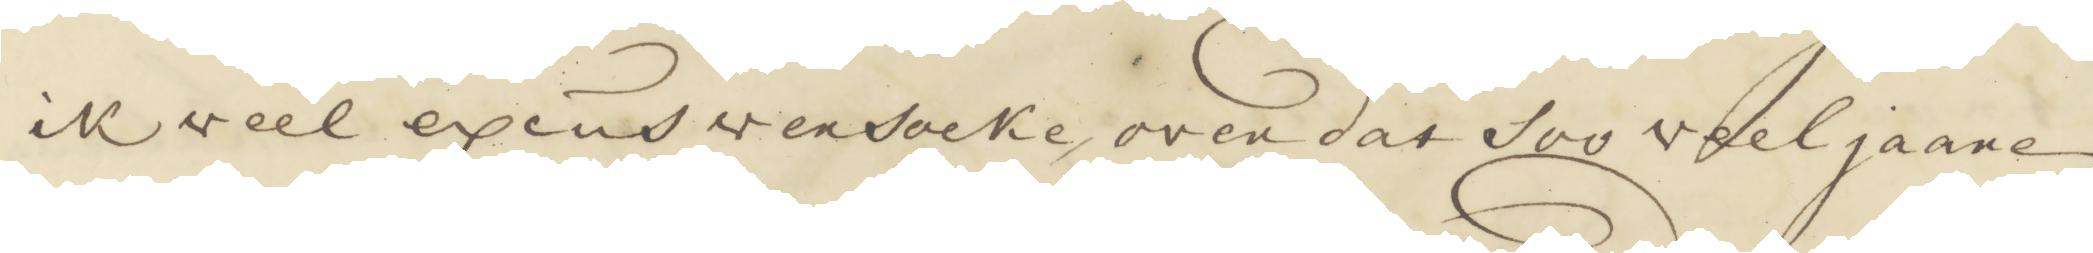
ik veel excus versoeke, over dat soo veel jaaren
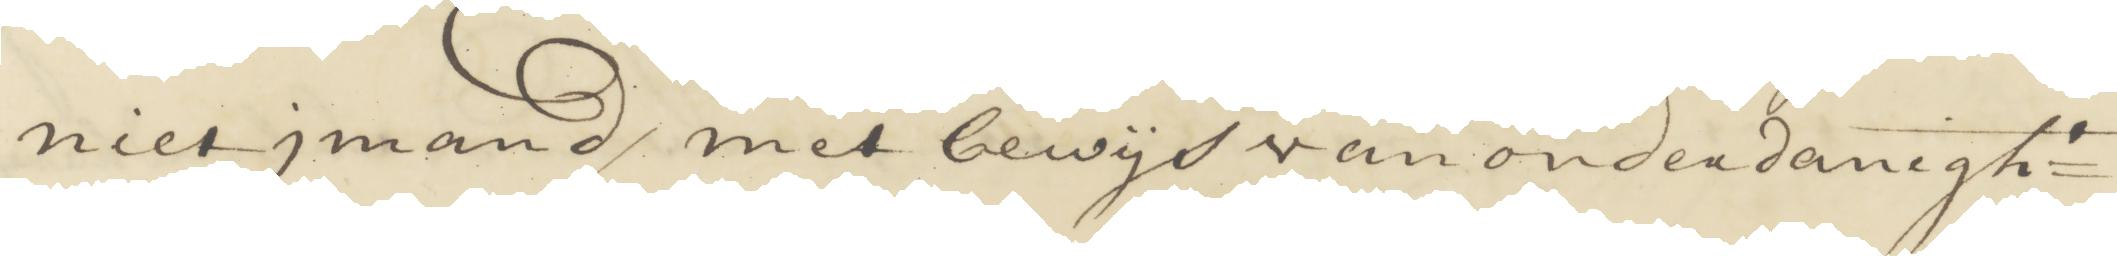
niet jmand/ met bewijs van onderdanigh=t
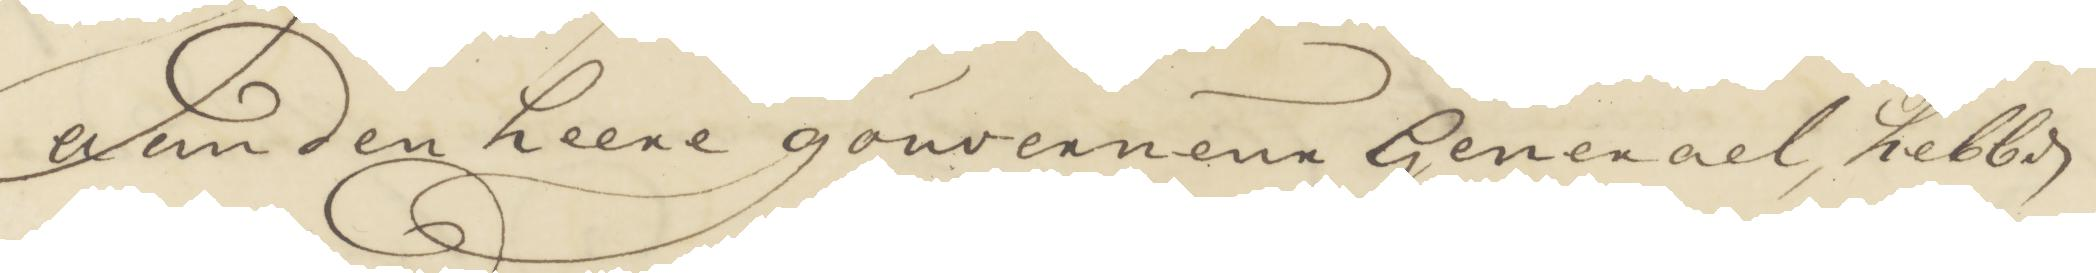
aan den heere gouverneur generael, hebben
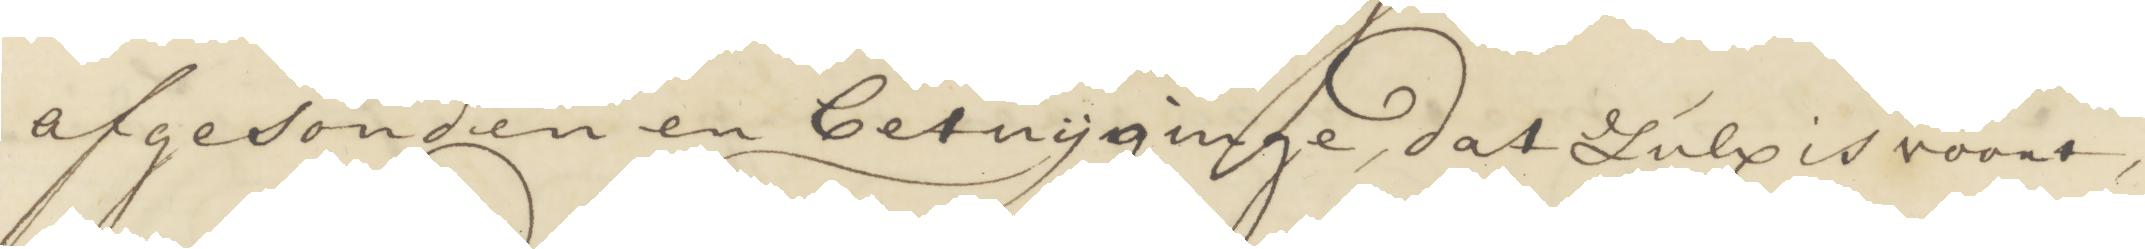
afgesonden en betuijginge, dat zulx is voort,
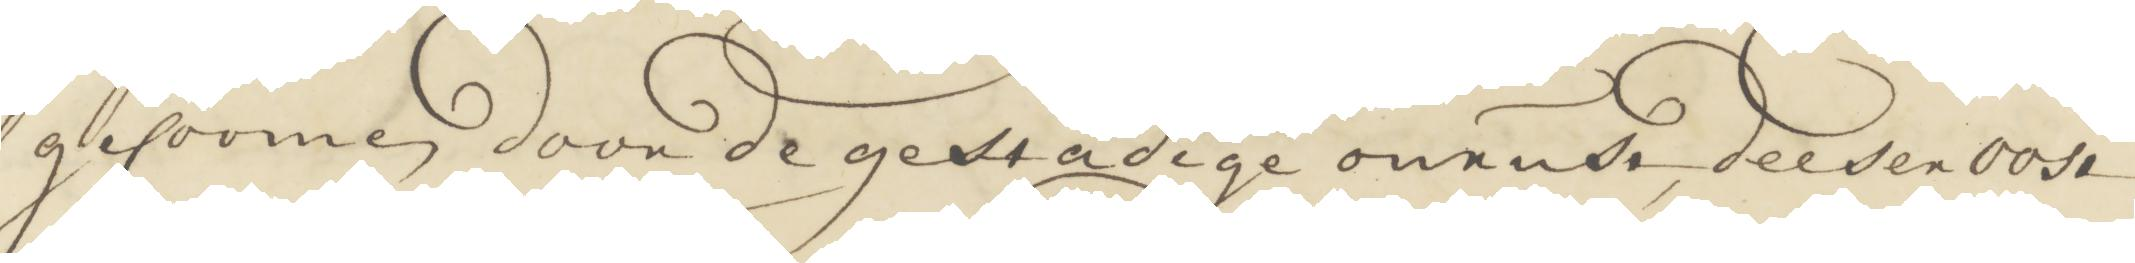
gecoomen door de gestadige onrust, deeser oost
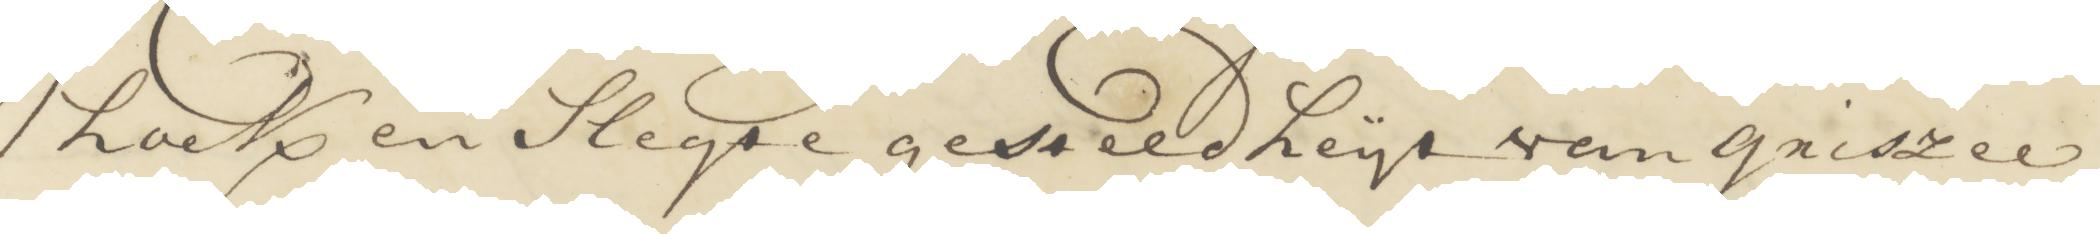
hoek en slegte gesteldheijt van griszee,
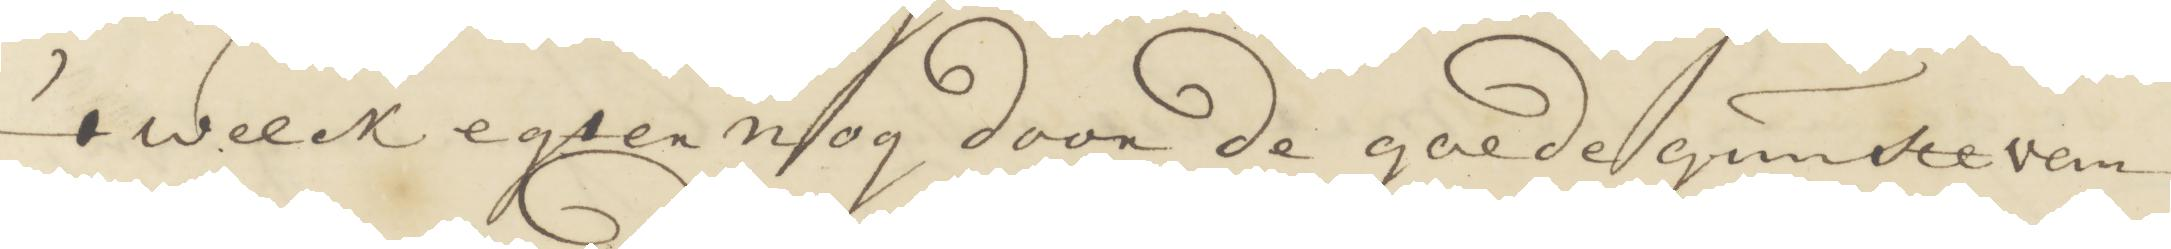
'twelck egter nog door de goede gunste van
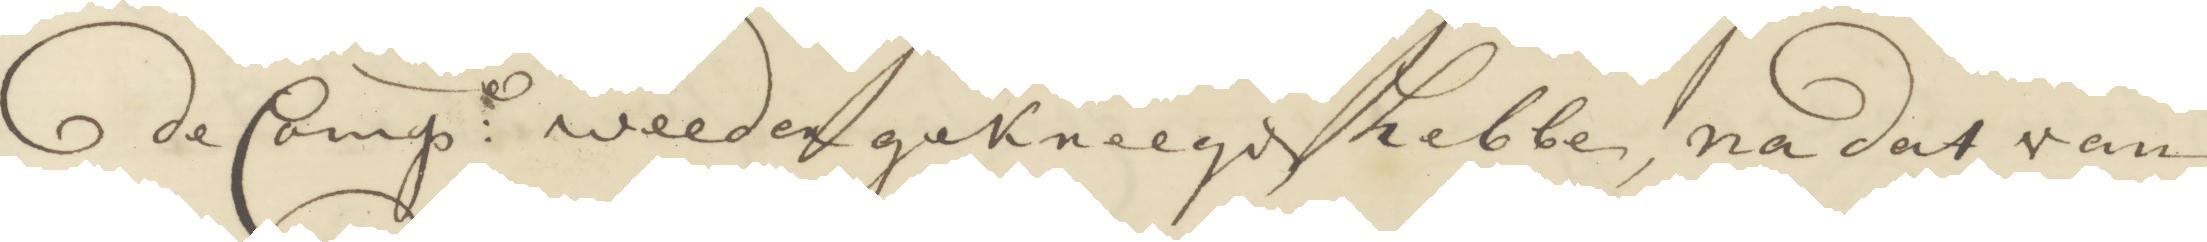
de Comp:e weeder gekreegen hebbe, na dat van
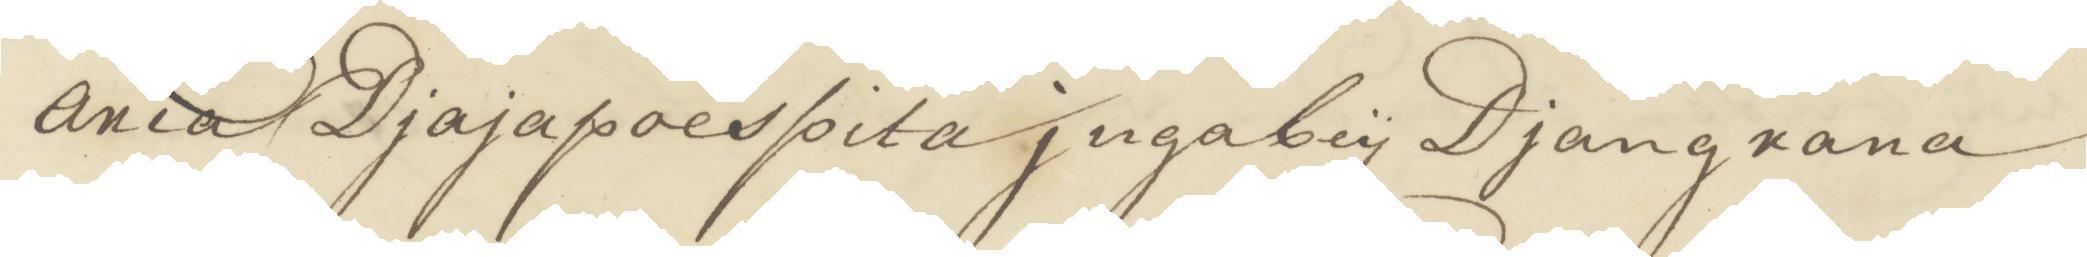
aria Djajapoespita jngabeij Djangrana
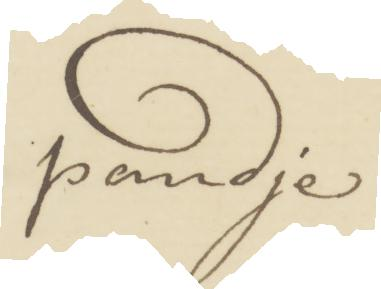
pandje
